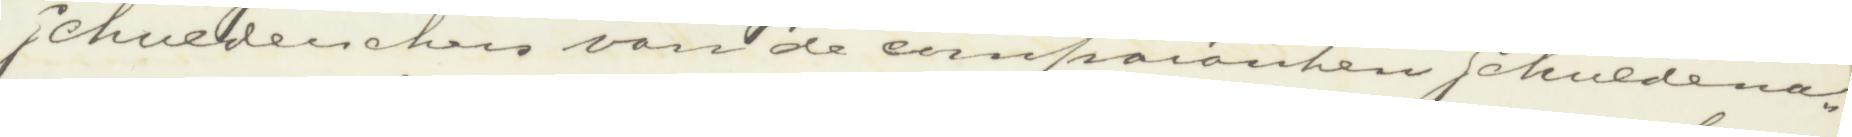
Schuldeischers van de comparanten Schuldena„
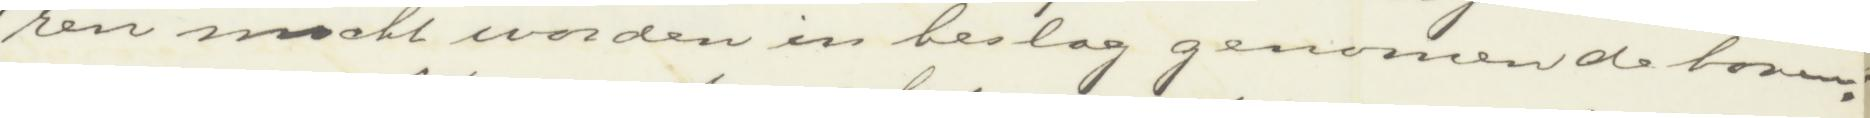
ren moeht worden in beslag genomen de boven„
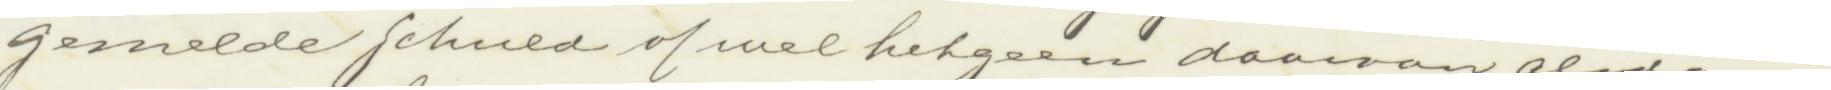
gemelde Schuld of wel hetgeen daarvan alsdan
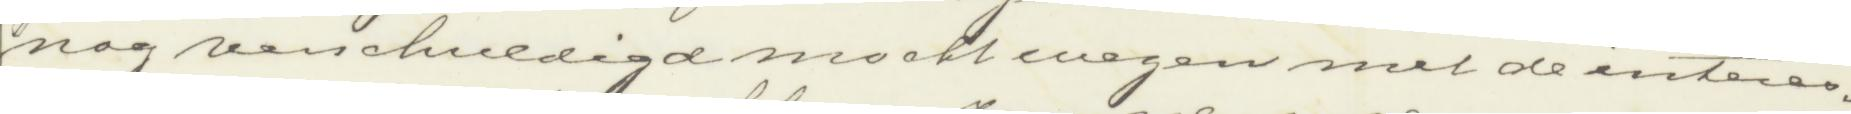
nog verschuldigd mocht wezen met de interes
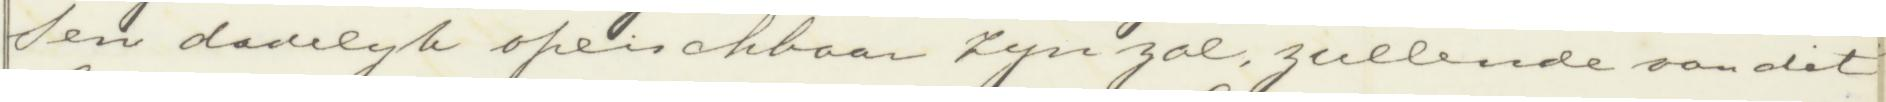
sen dadelyk opeischbaar zyn zal, zullende van dit
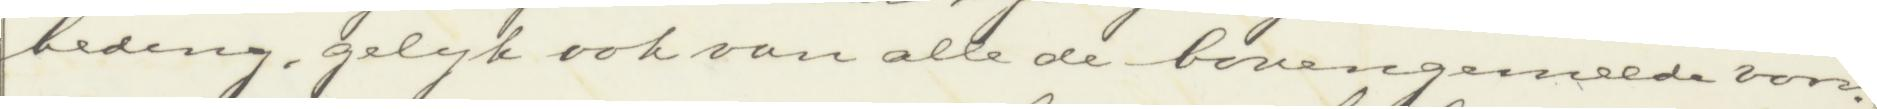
beding, gelyk ook van alle de bovengemelde voor„
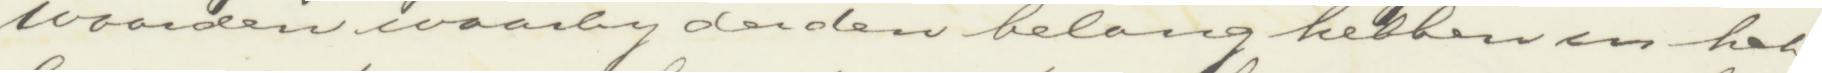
waarden waarby derden belang hebben in het
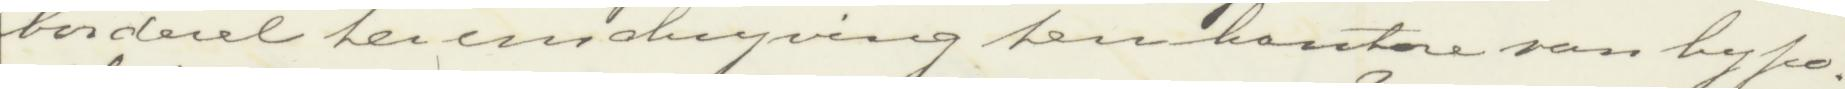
borderel ter inschryving ten kantore van hypo
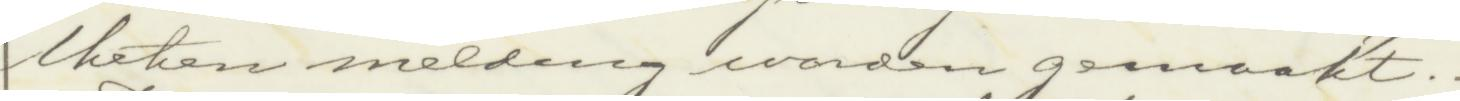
theken melding worden gemaakt.
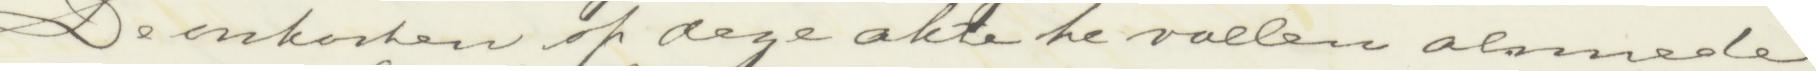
De onkosten op deze akte te vallen alsmede
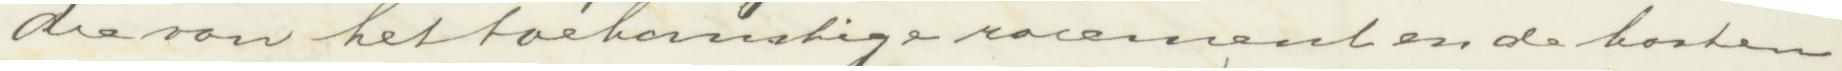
die van het toekomstige roiement en de kosten
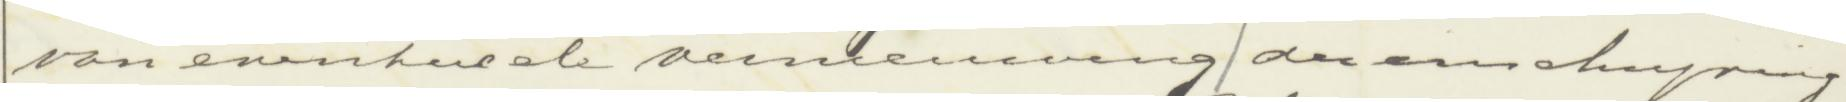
van eventuele vernieuwing| der omschryving
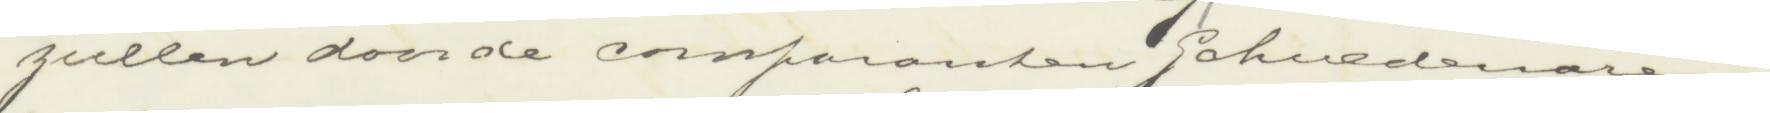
zullen door de comparanten Schuldenaren
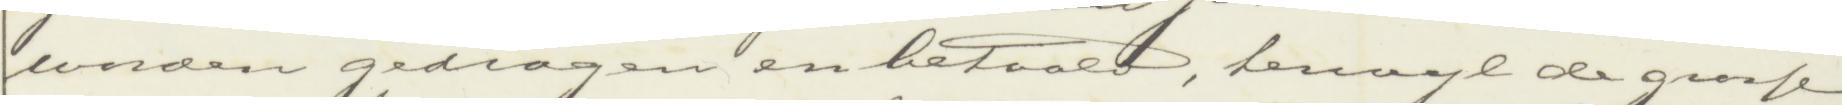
worden gedragen en betaald, terwyl de grosse
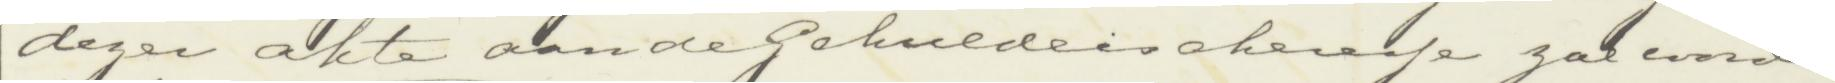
dezer akte aan de Schuldeischeresse zal worden
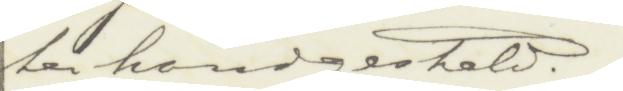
ter handgesteld.
